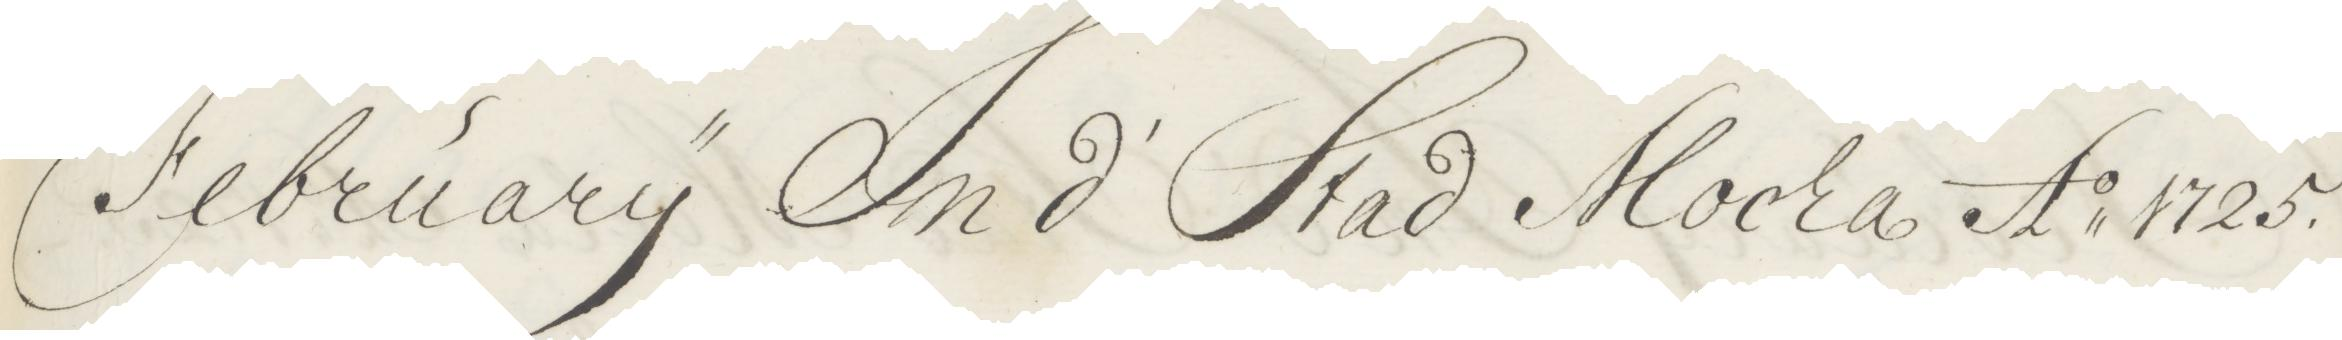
Februarij In d’ Stad Mocha A„o 1725.
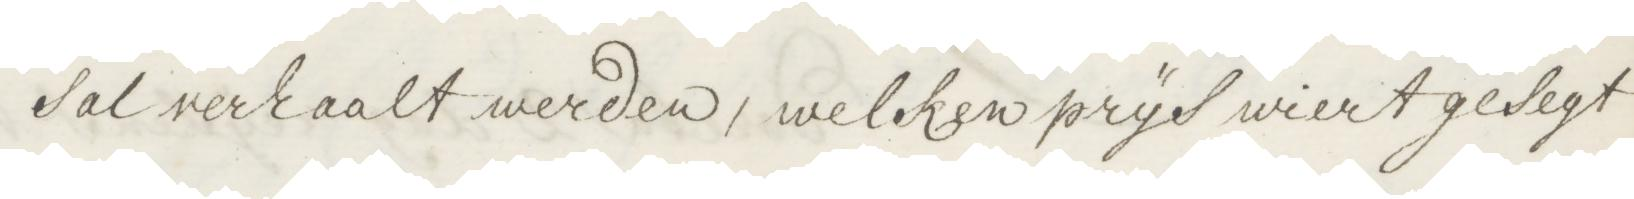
sal verhaalt werden, welken prijs wiert gesegt
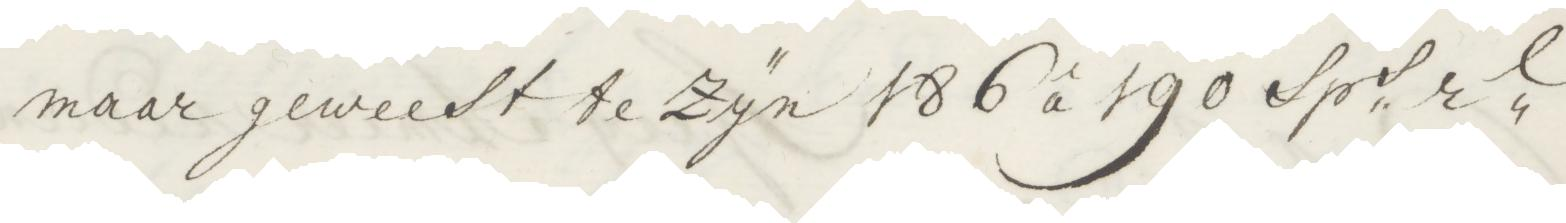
maar geweest te zijn 186 â 190 sp„s r„l
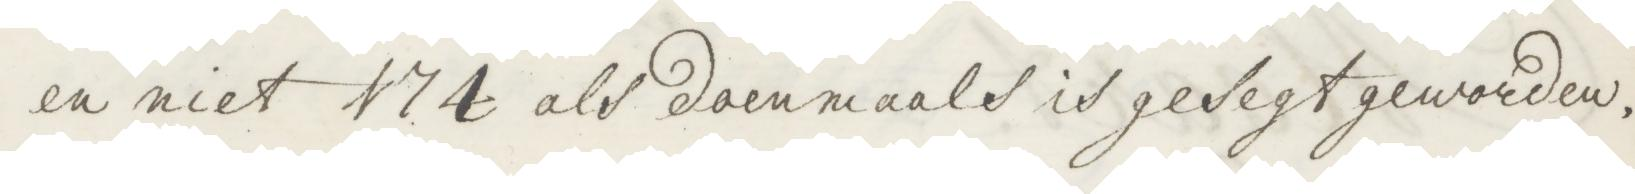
en niet 174 als doenmaals is gesegt geworden,
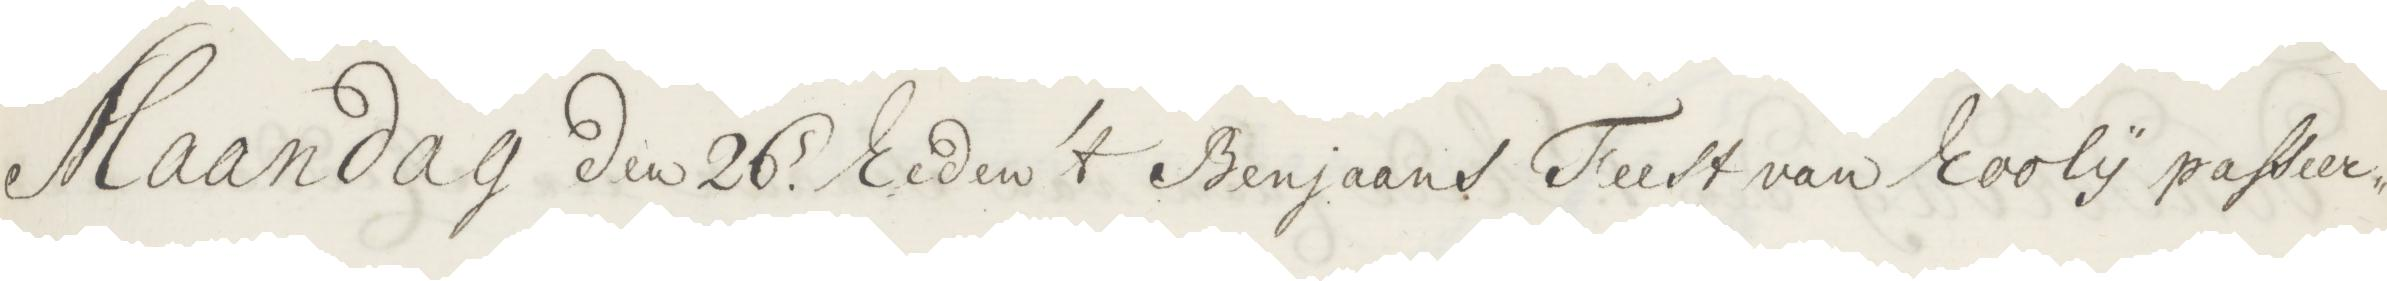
Maandag den 26.' heden ’t Benjaans Feest van hoolij passeer„
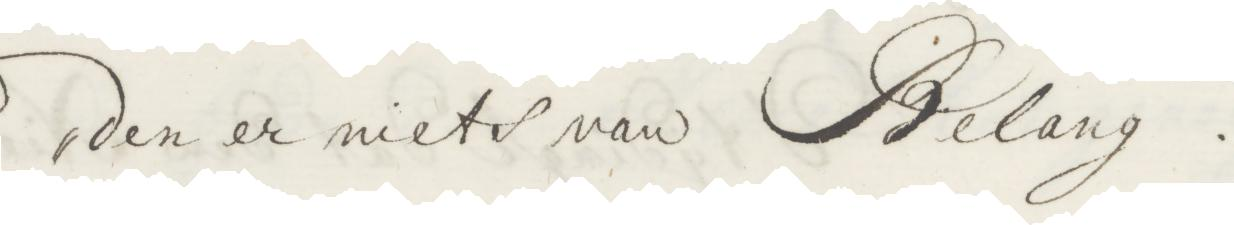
„den er niets van Belang.
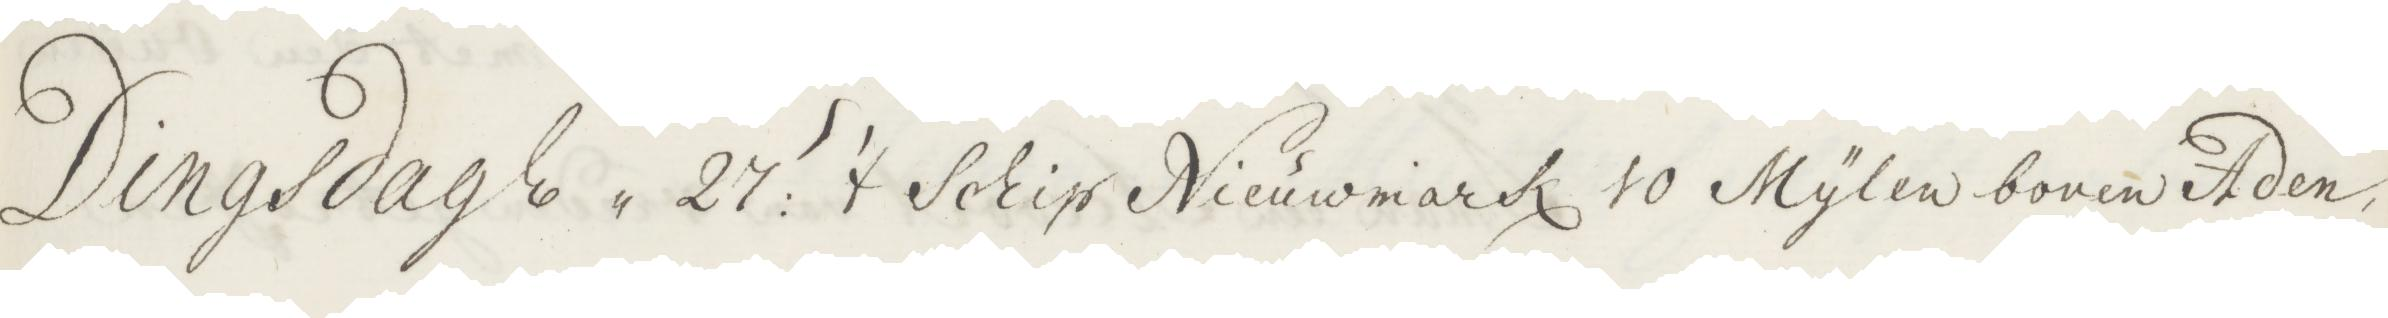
Dingsdagh „ 27:' ’t schip Nieuwmark 10 Mijlen boven Aden,
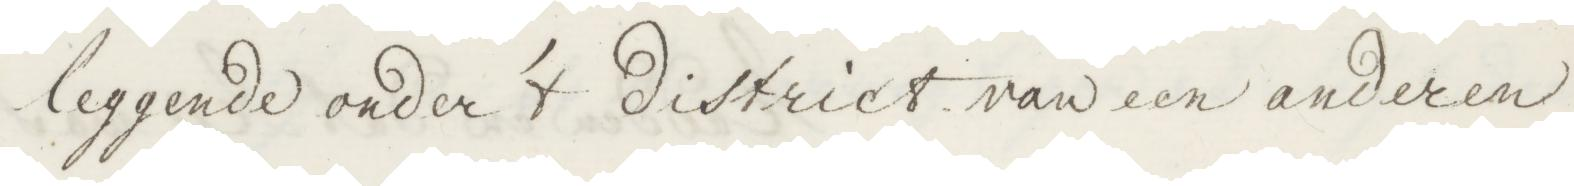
leggende onder ’t district van een anderen
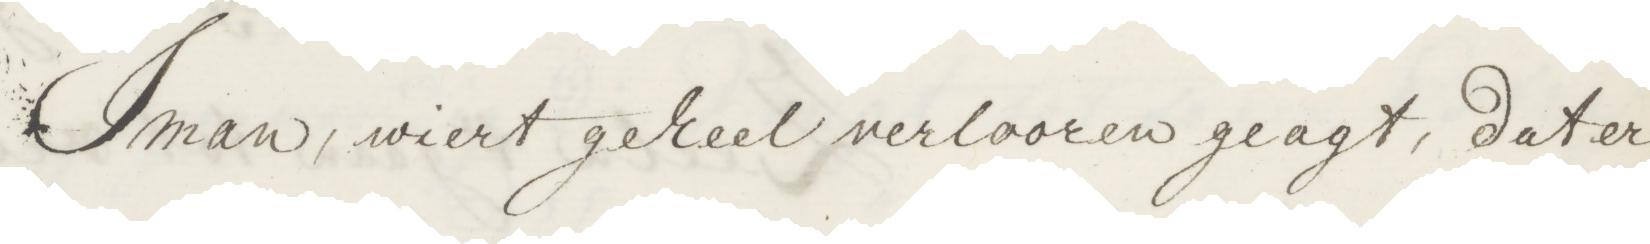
Iman, wiert geheel verlooren geagt, dat er
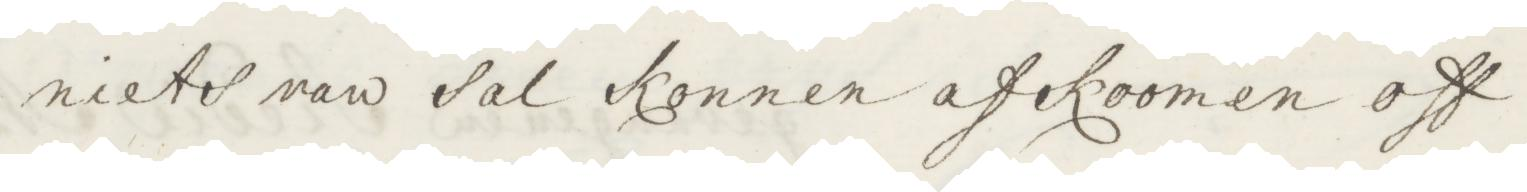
niets van sal konnen afkoomen off
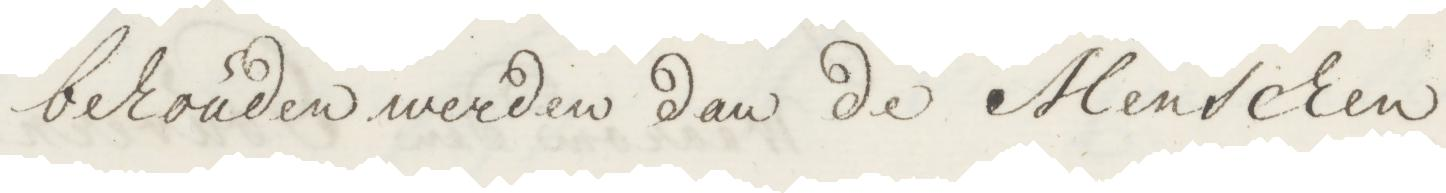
behouden werden dan de Menschen
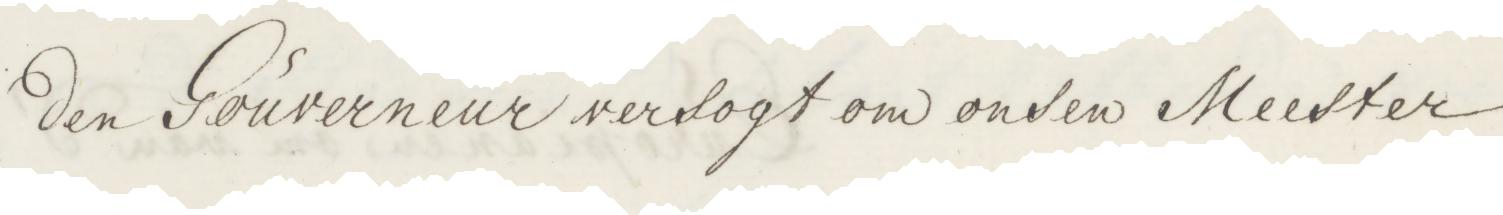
den Gouverneur versogt om onsen Meester
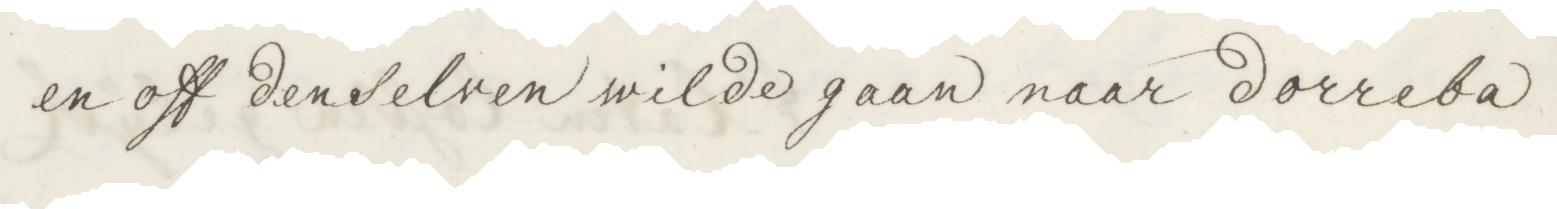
en off denselven wilde gaan naar dorreba
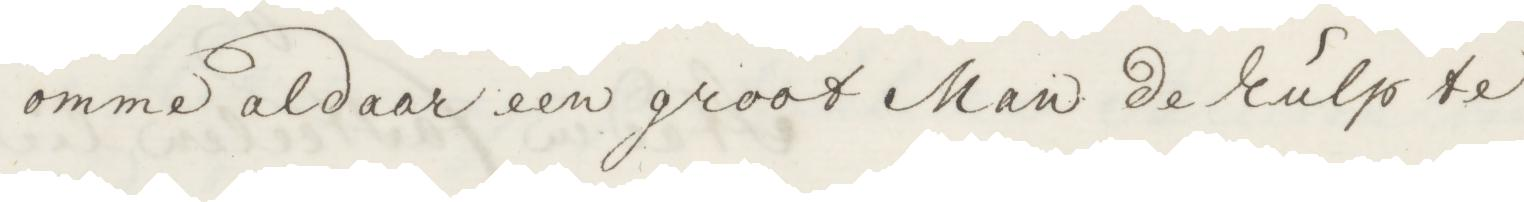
omme aldaar een groot Man de hulp te
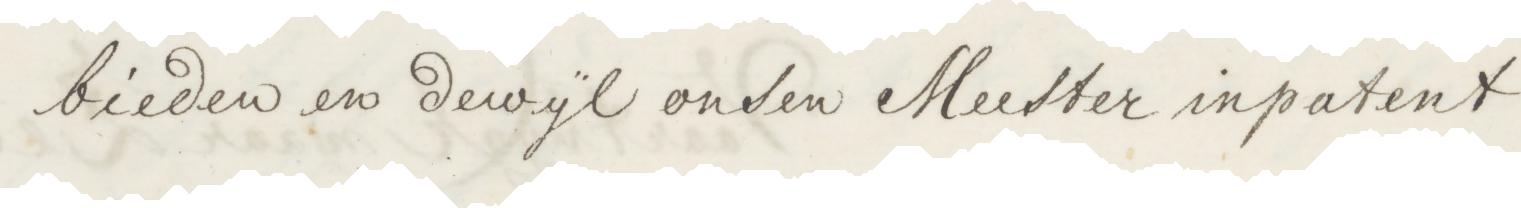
bieden en dewijl onsen Meester inpatent
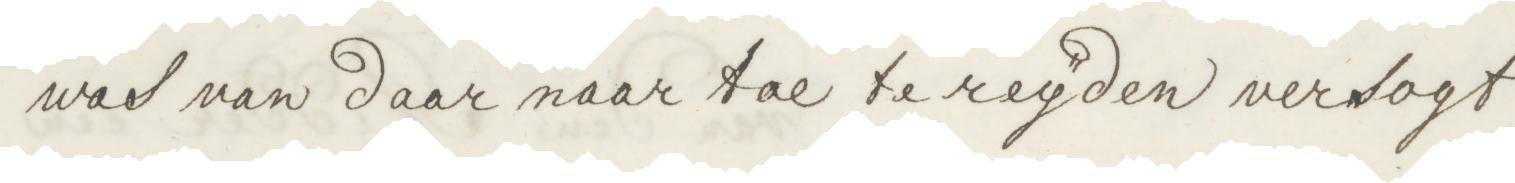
was van daar naar toe te reijden versogt
